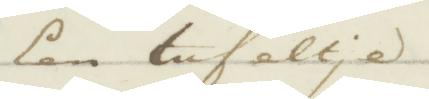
Een tafeltje
